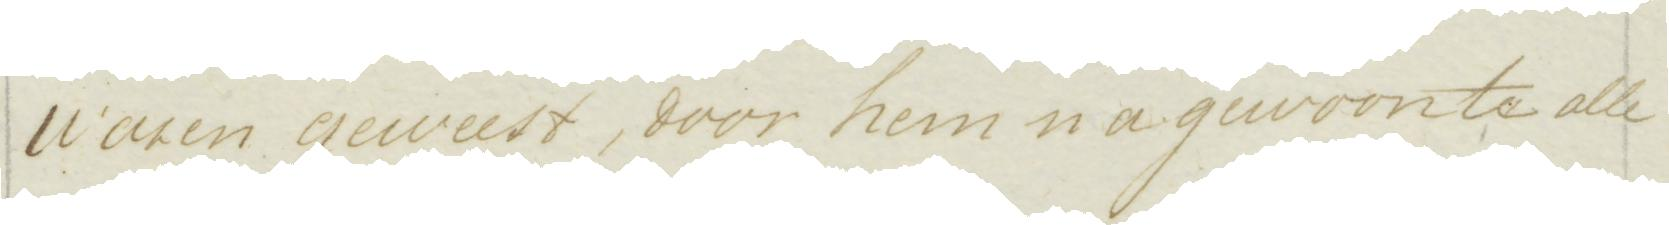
waren geweest, door hem na gewoonte alle
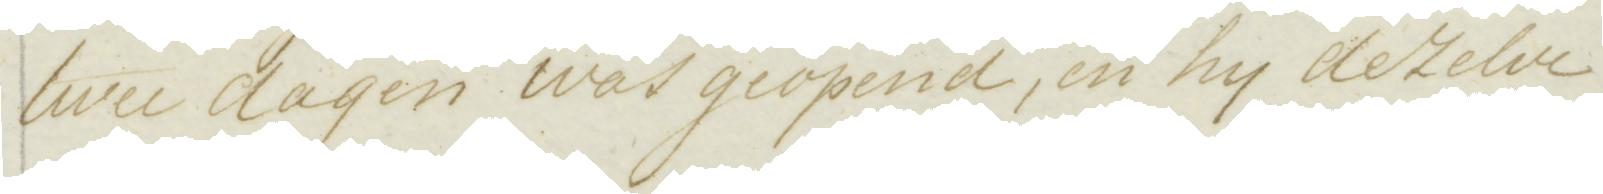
twee dagen was geopend, en hij dezelve
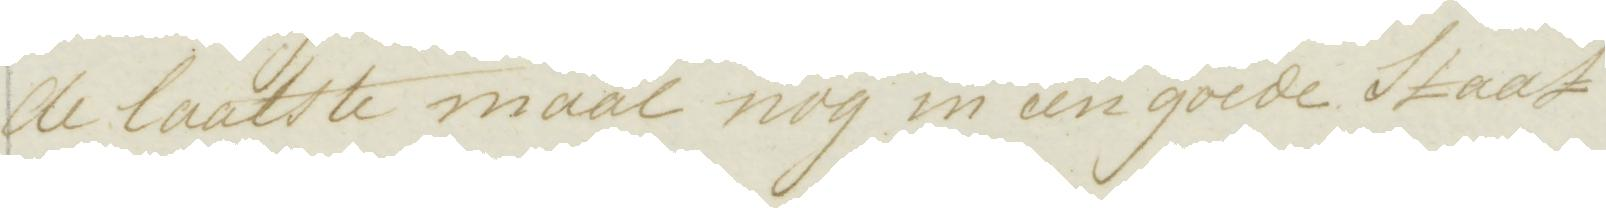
de laatste maal nog in een goede staat
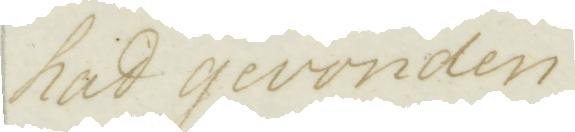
had gevonden
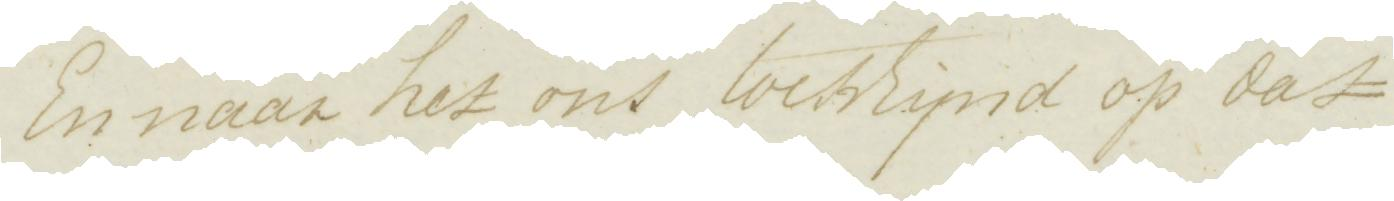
En naar het ons toeschijnd op dat
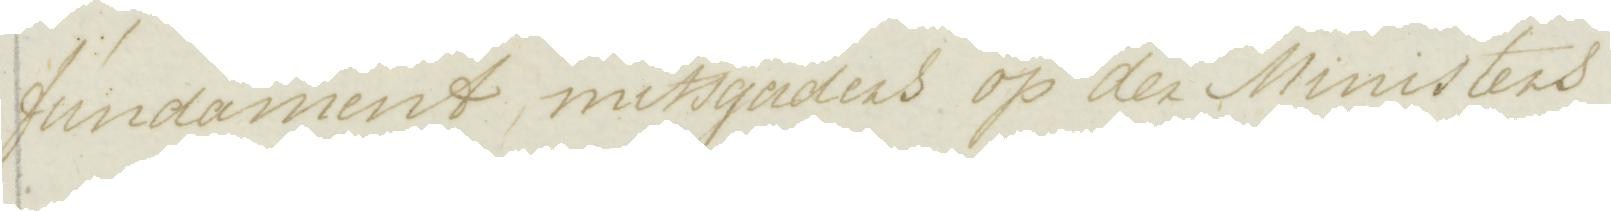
fundament, mitsgaders op der Ministers
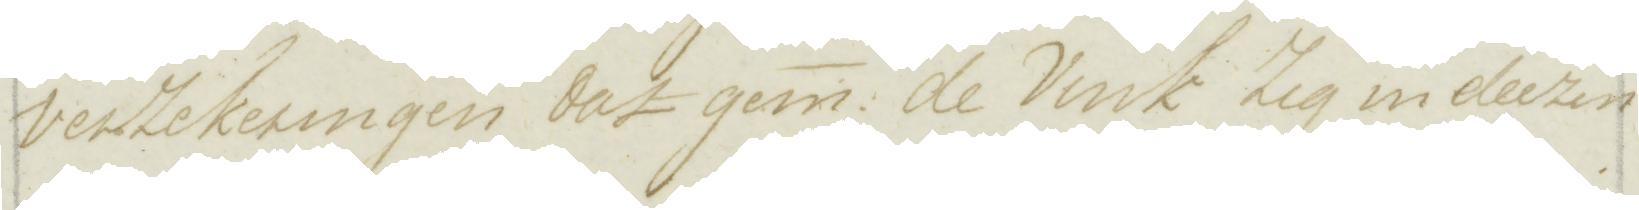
verzekeringen dat gem: de Vink Zig in deezen
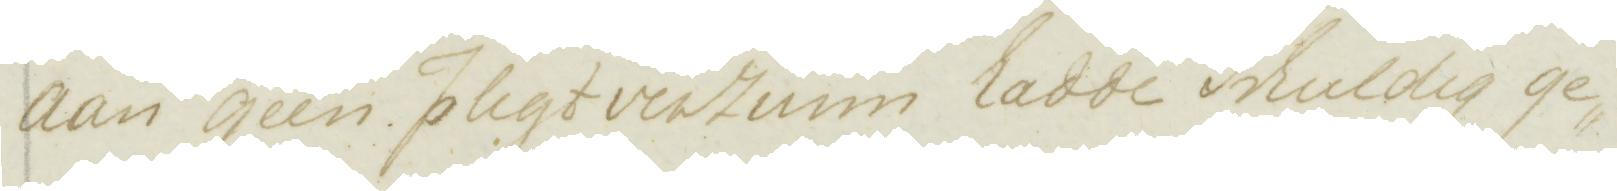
aan geen. Pligtverzuim hadde schuldig ge„
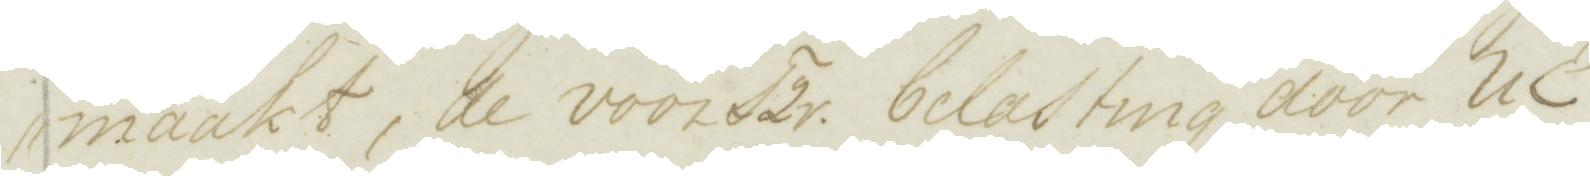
„maakt, de voorszr. belasting door UE
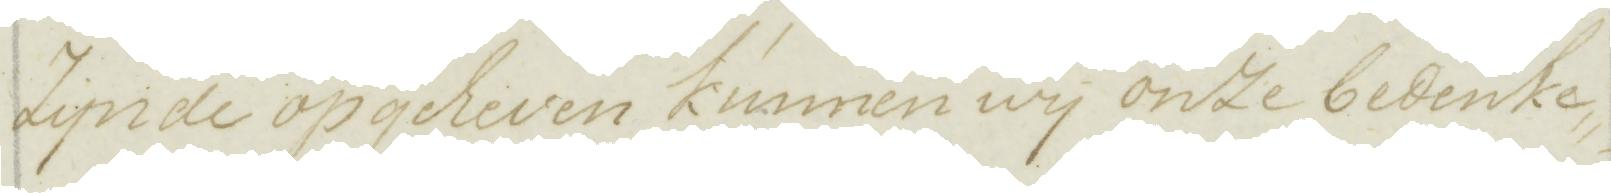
Zijnde opgeheven kunnen wij onze bedenke„
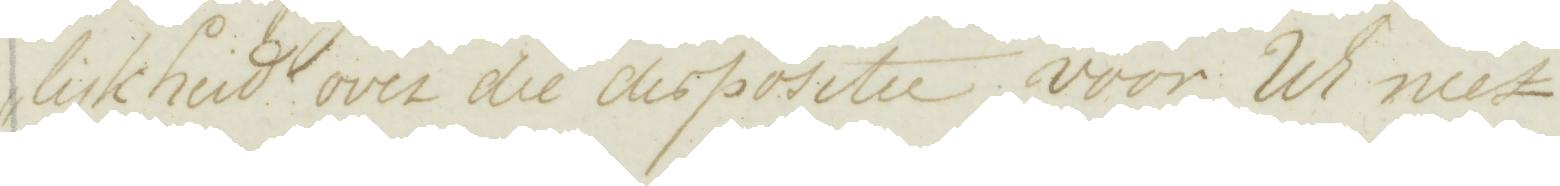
„lijkheid over die dispositie voor UE niet
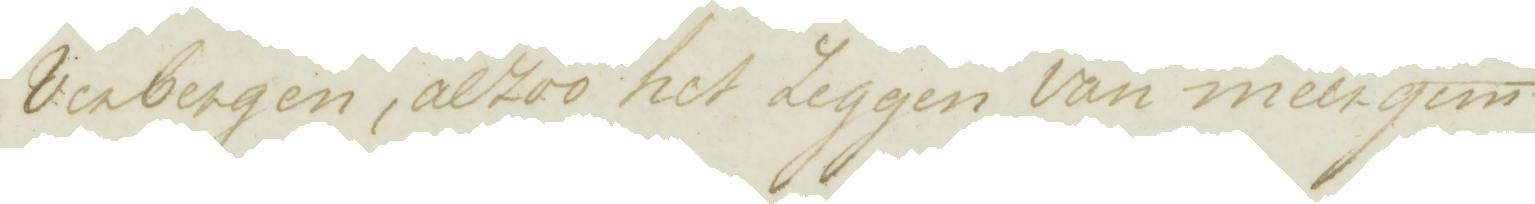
verbergen , alzoo het Zeggen van meer gem:
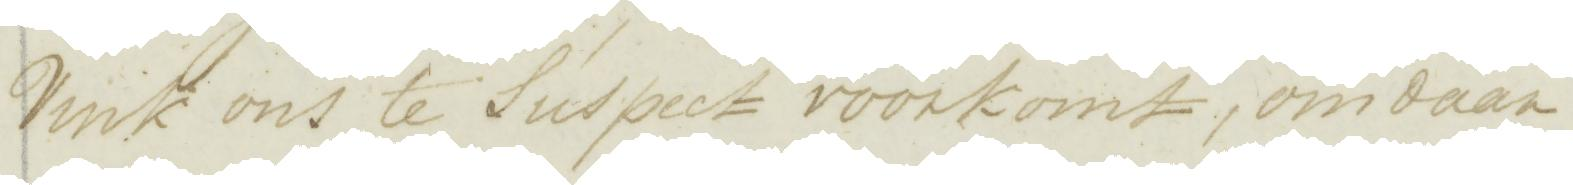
Vink ons te suspect voorkomt, om daar
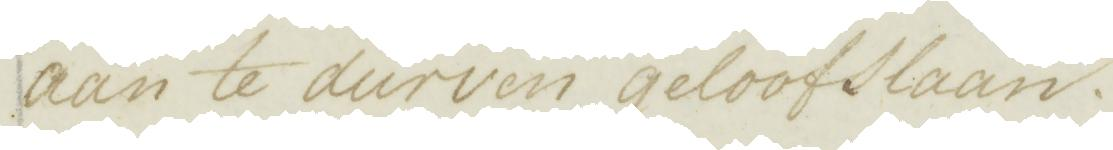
aan te durven geloofslaan.
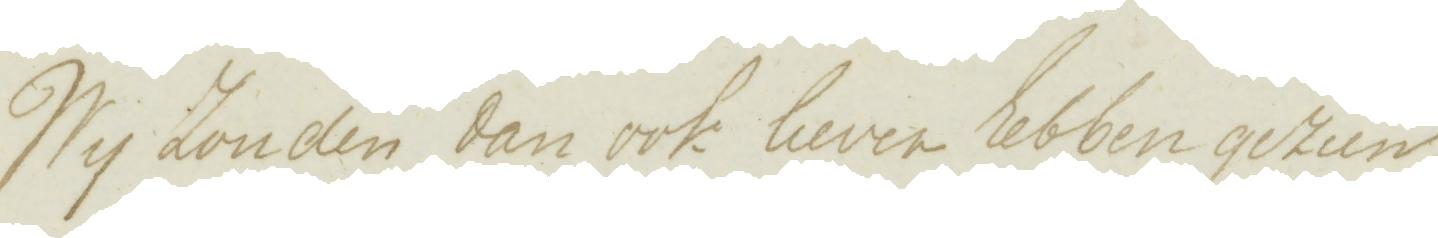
Wij zouden dan ook liever hebben gezien,
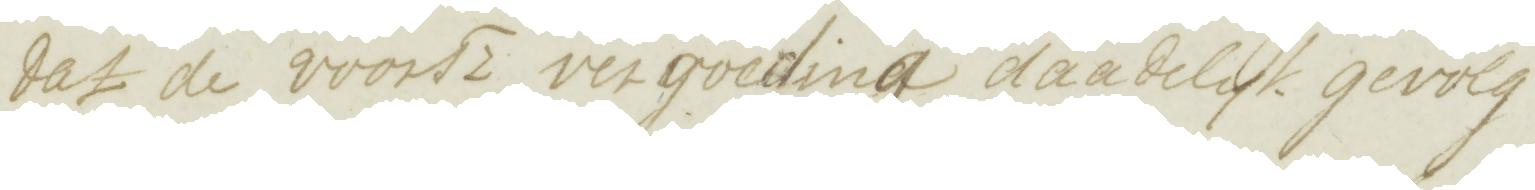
dat de voorsz vergoeding daadelyk gevolg
